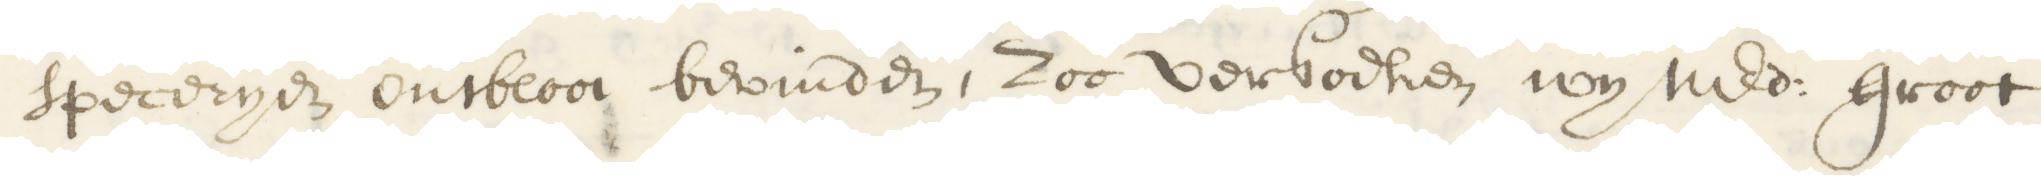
specerijen ontbloot bevinden, zoo versoeken wij UEd: groot
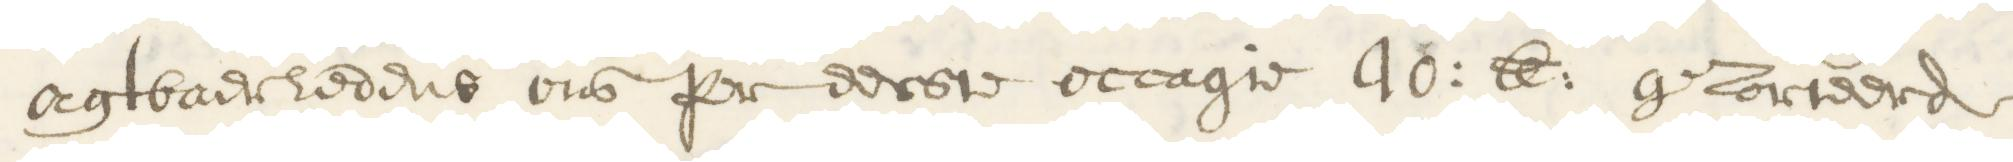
agtbaerhedens ons per eerste occagie 40: lb: gezorteerde
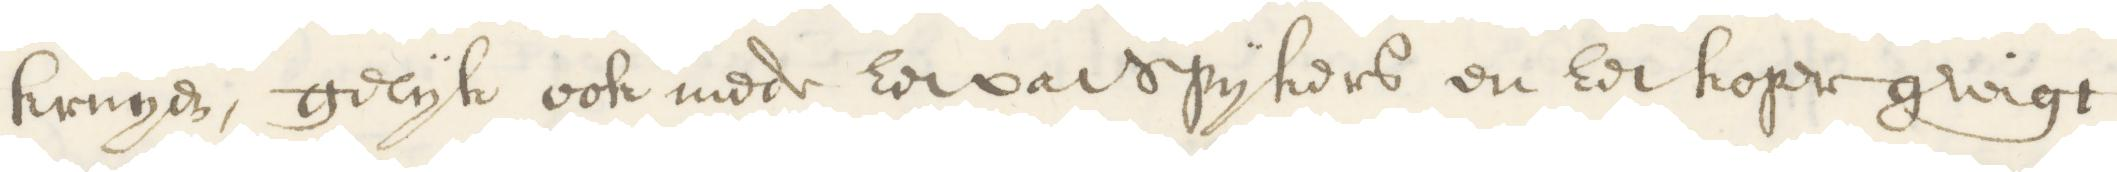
kruijen, gelijk ook mede het vatspijkers en het koper gewigt
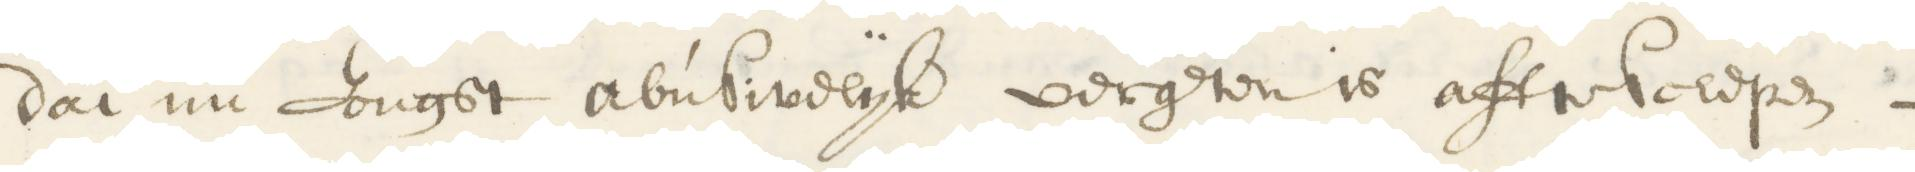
dat nu Jongst abusivelijk vergeten is aff te schepen
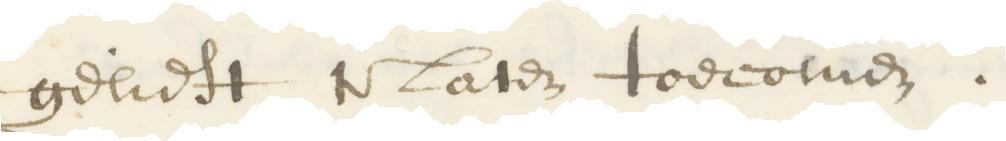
gelieft te laten toecomen.
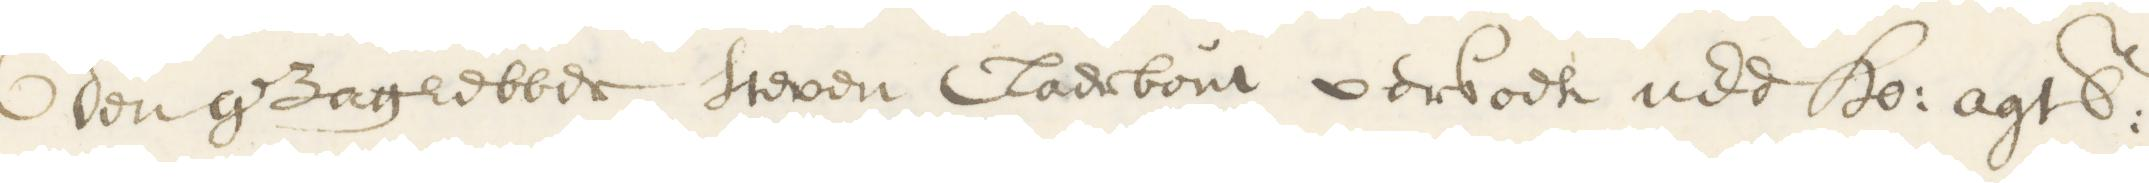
Den gezaghebber steven Claerbout versoek uEd Ho: agtb:e
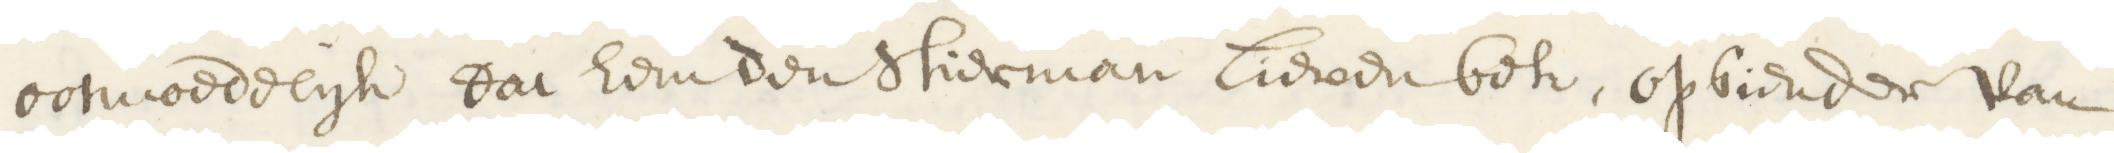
ootmoedelijk dat hem den stierman lievenbek, opsiender van
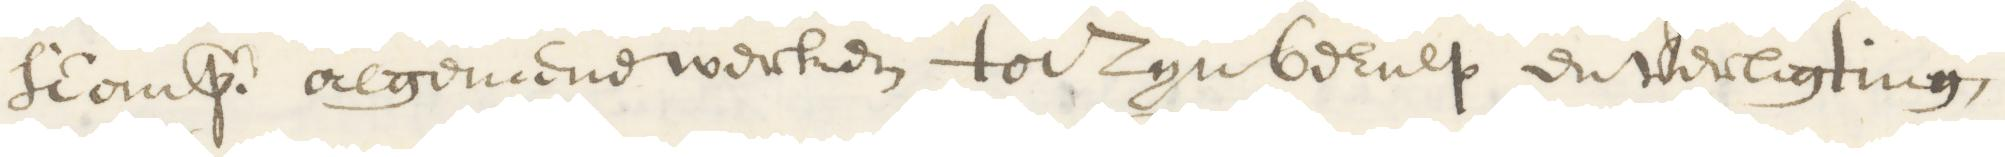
s'Comp. algemeene werken tot zyn behulp en verligting,
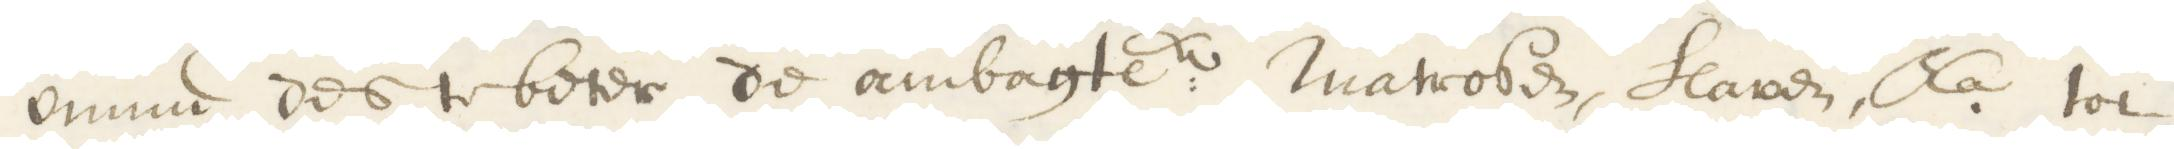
omme des te beter de ambagtl:n matrosen, slaven, &a tot
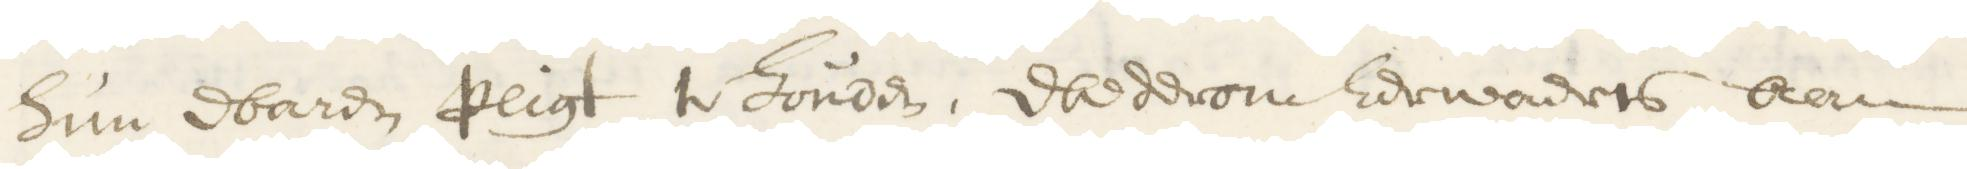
hun waren pligt te houden, wederom herwaerts aan
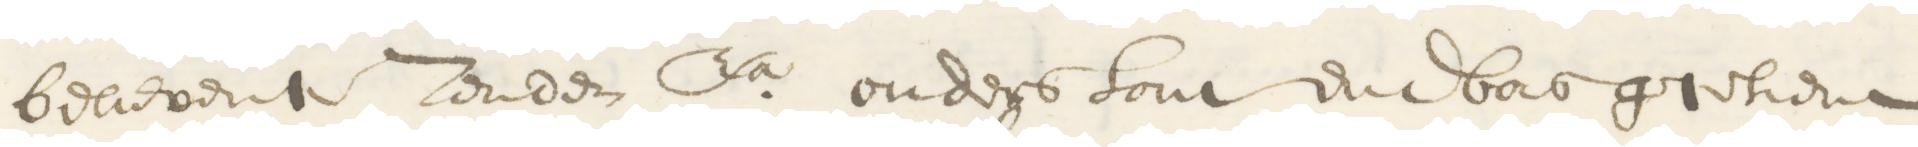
believen te zenden &a onderstont en was getekent
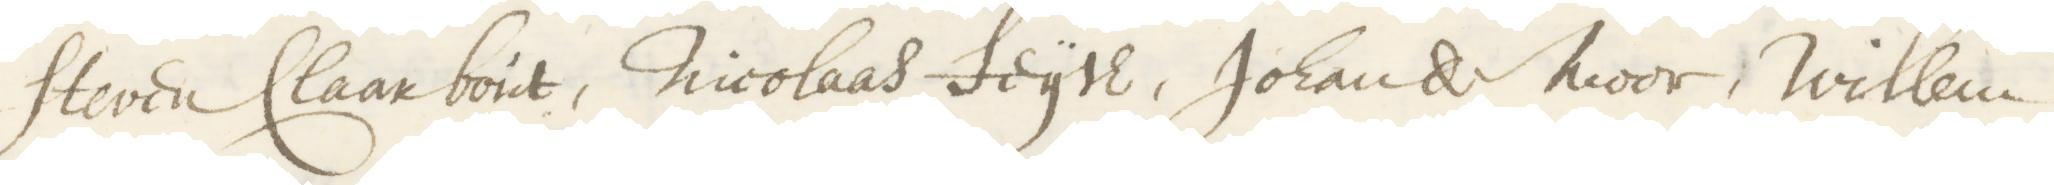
Steven Claarbout, Nicolaas Seijth, Johan de koor, Willem
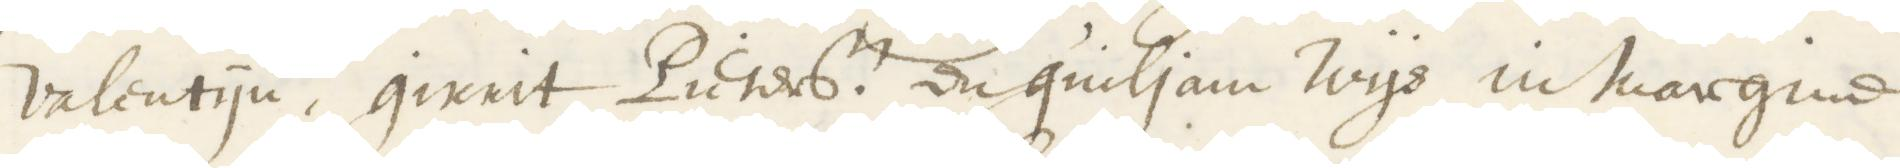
Valentijn, girrit Pieters.n en guiljam Wijs in margine
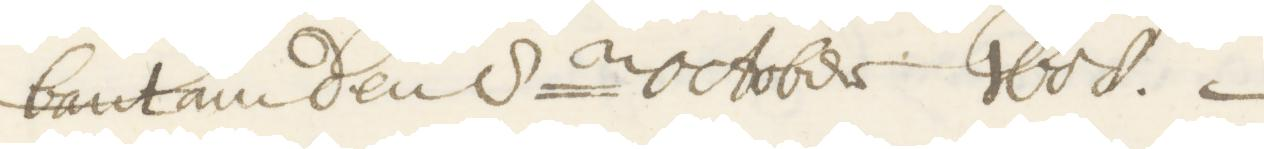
bantam den 8=n october 1688. —
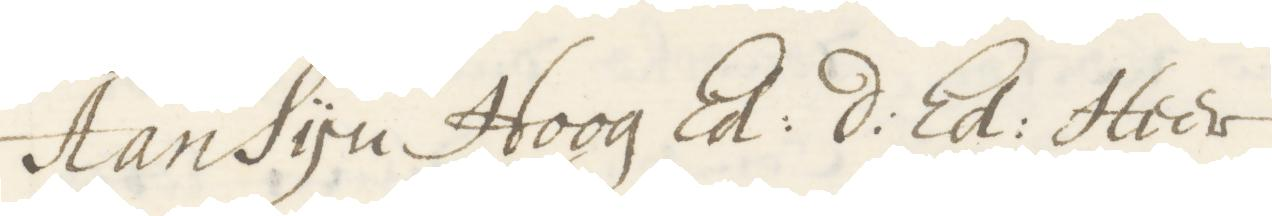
Aan sijn Hoog Ed: d: Ed: Heer
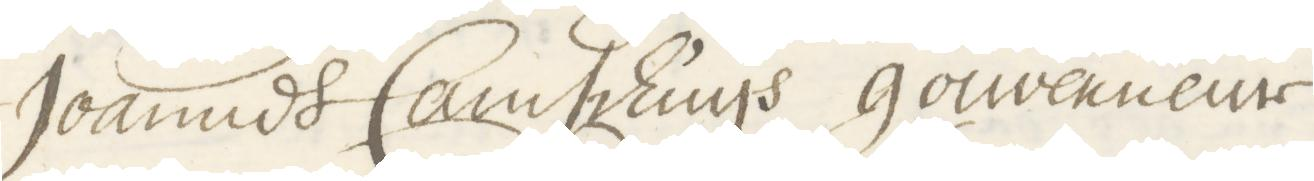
Joannes Camphuijs gouverneur
